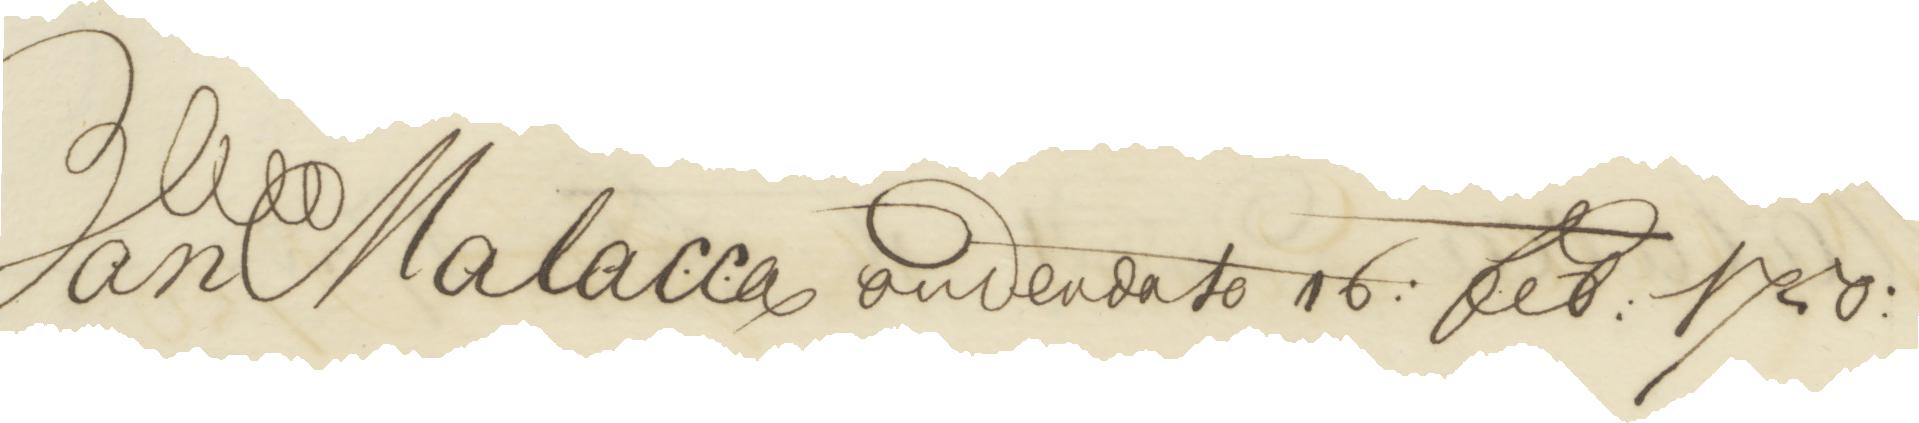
Van Malacca onder dato 16: feb: 1750:
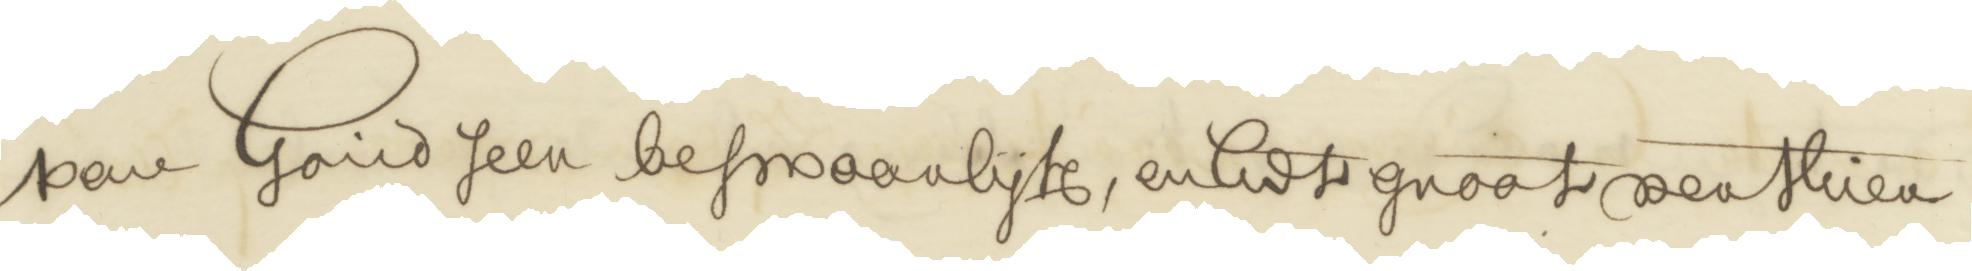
van Goud seer beswaarlijk, en het groot verthier
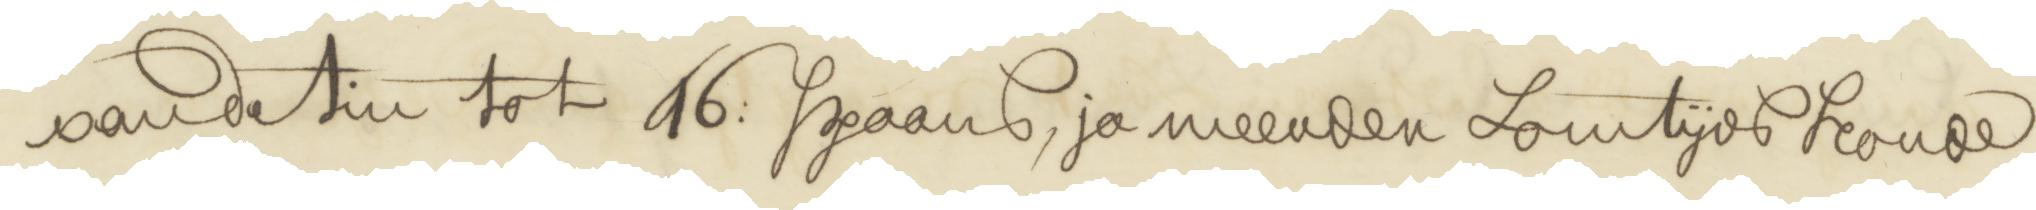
van de tin tot 46: spaans, ja meerder somtijes konde
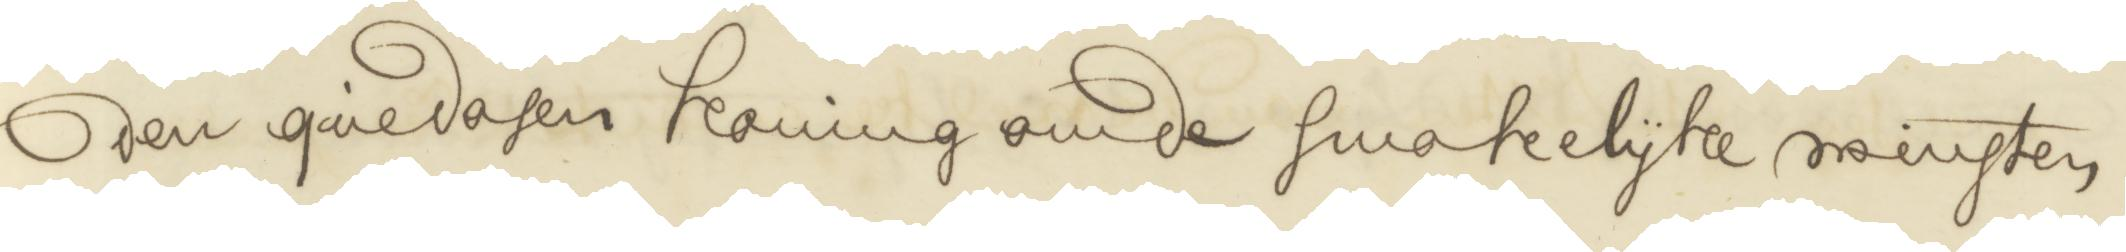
den quedasen koning om de smakelijke winsten
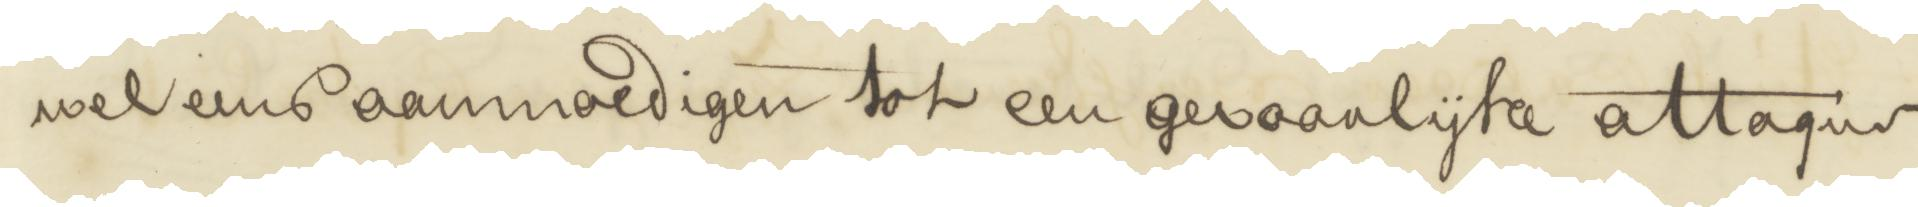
wel eens aanmoedigen tot een gevoorlijke attaque
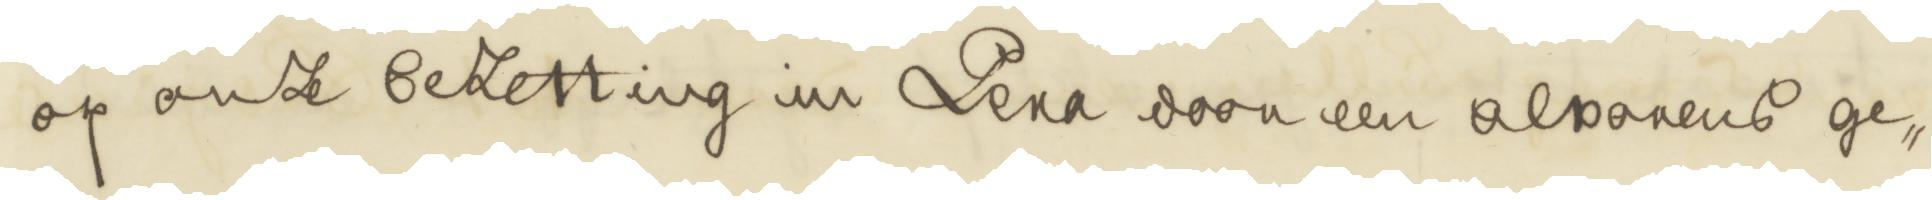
op onse bezetting in Pera door een alvorens ge„
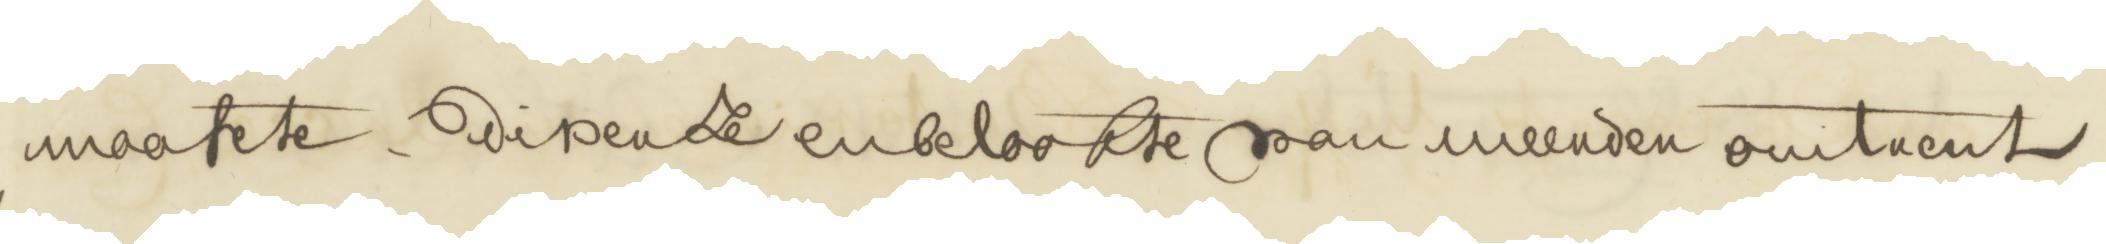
„maakte diverse en beloofte van meerder omtrent
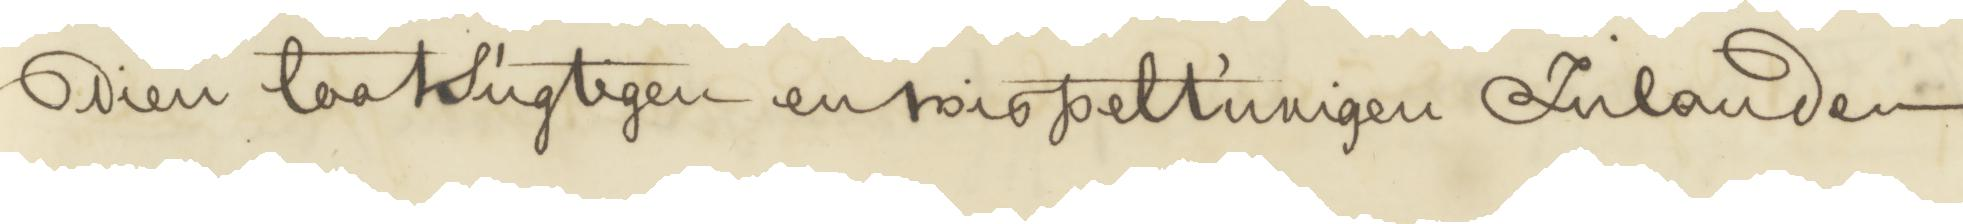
dien lootsugtigen en wispelturigen Jnlander
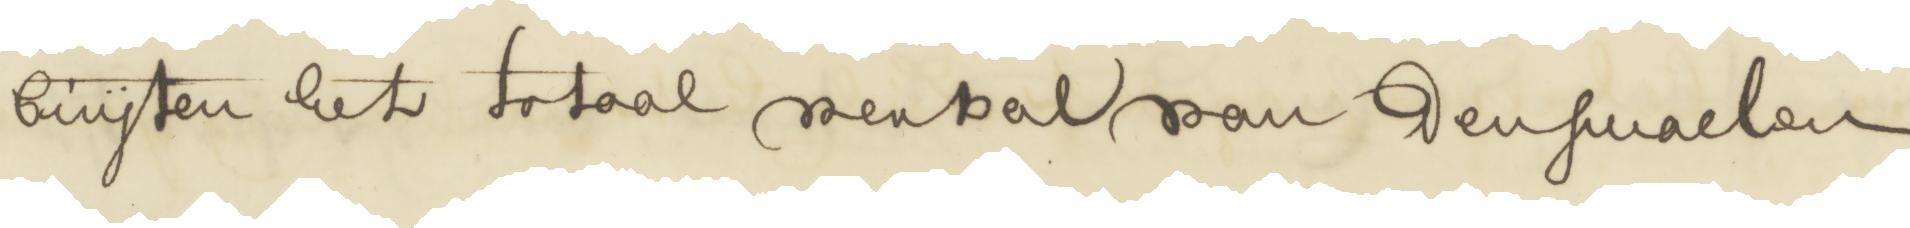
buijten het totaal verval van den swaelen
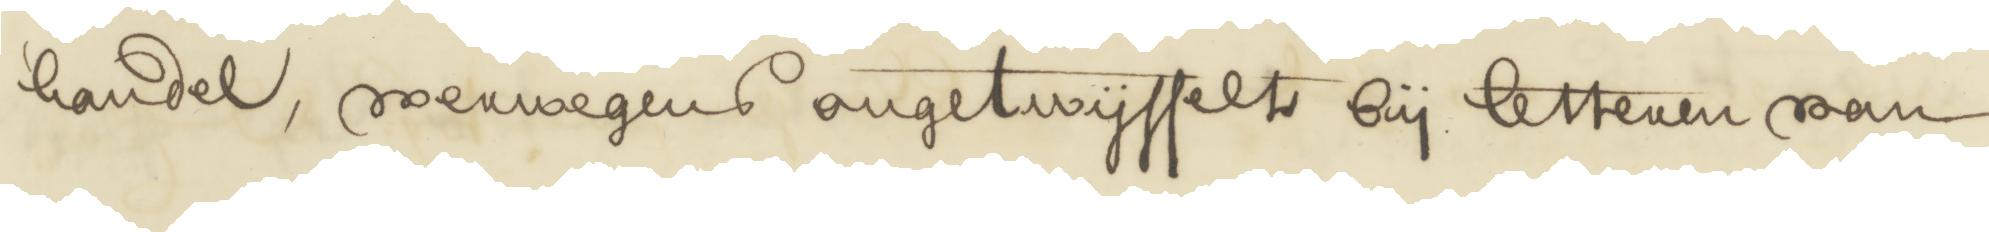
handel, verwegens ongetwijffelt bij letteren van
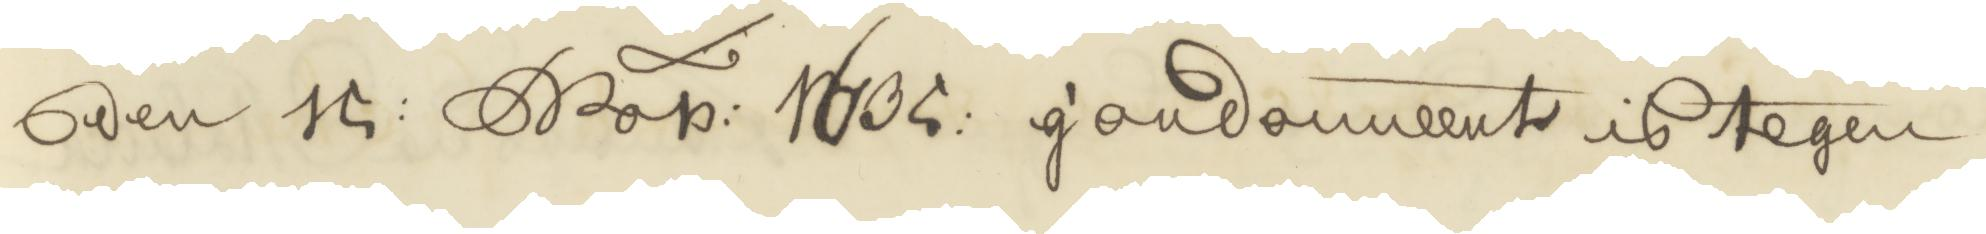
den 15: Nov: 1685: g'ordonneert is tegen
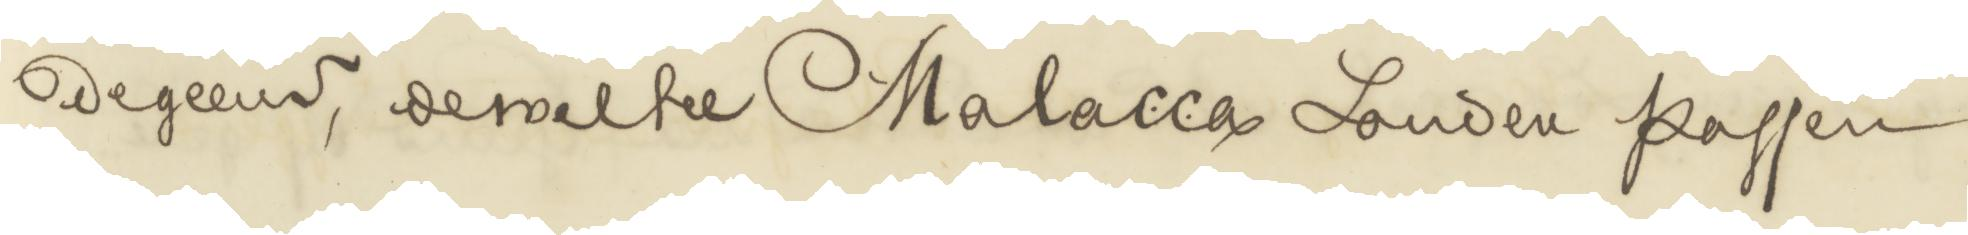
de geene, dewelke Malacca sonder passen
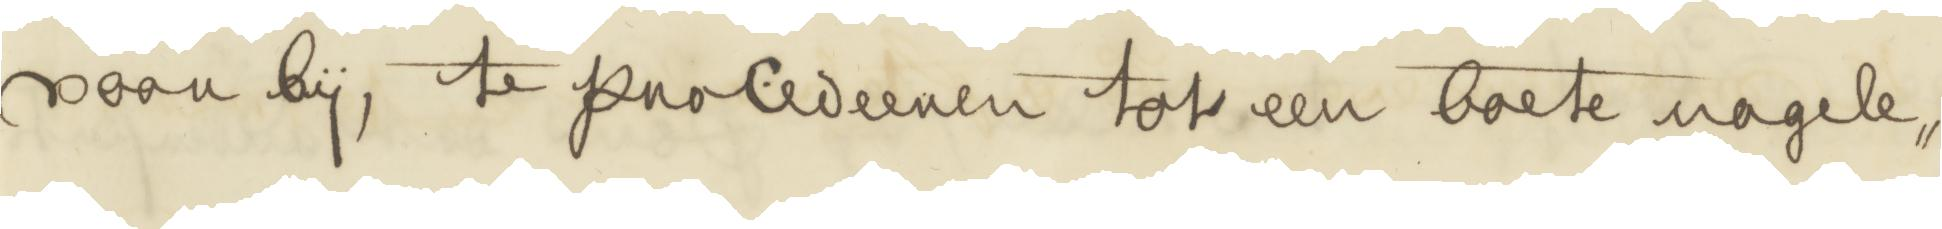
voor bij, te procedeeren tot een boete nagele„
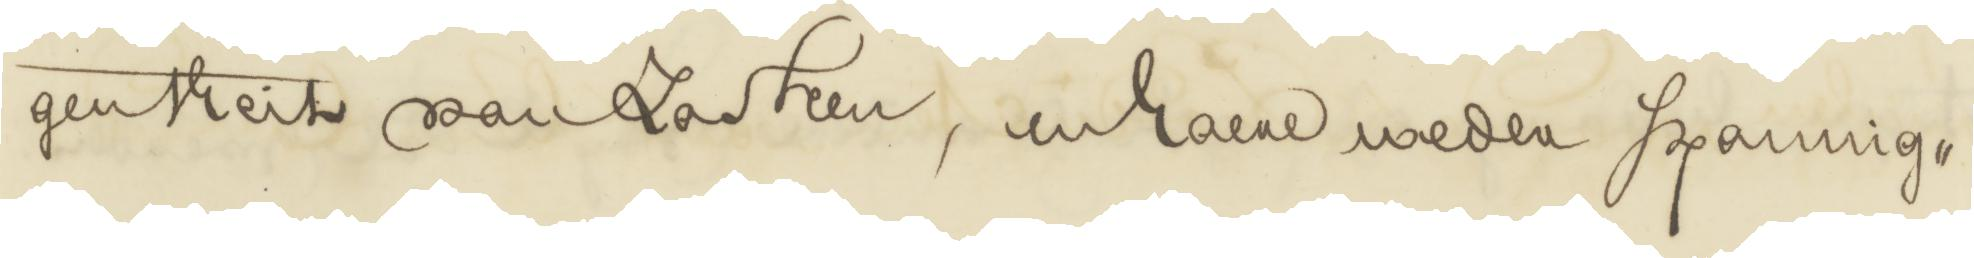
gentheit van zaeken, en haere weder spannig„
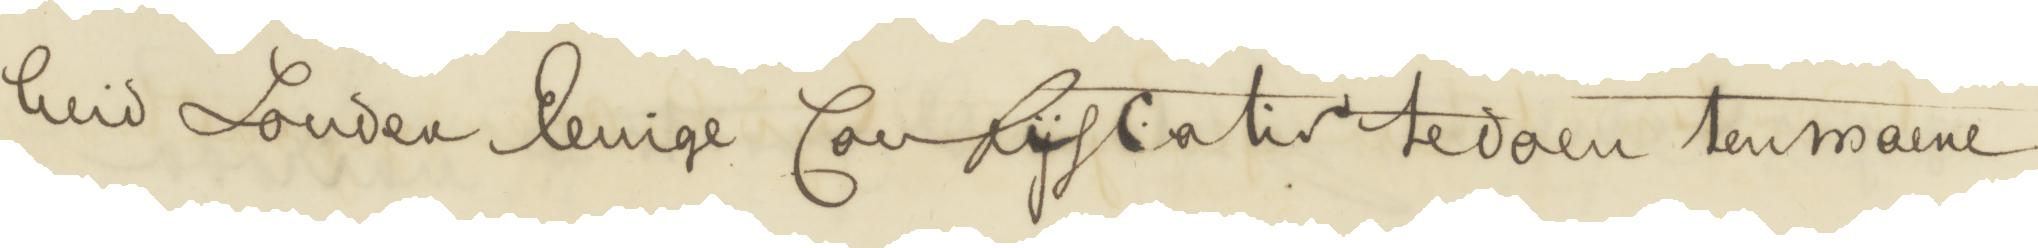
heid sonder Eenige confijscatie te doen ten waere
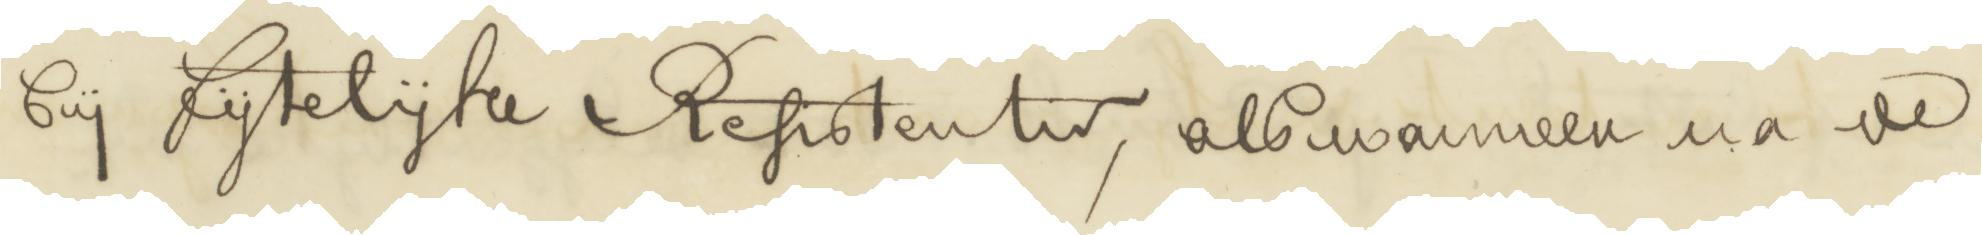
bij fijtelijke Resistentie, als wanneer na de
